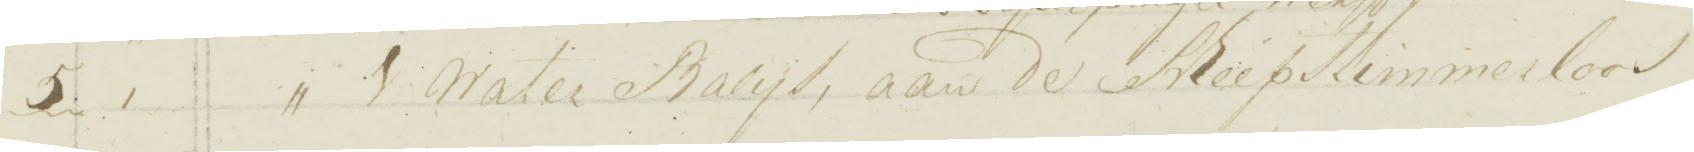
5: „ „ 1 water Balijs, aan de scheepstimmerloos
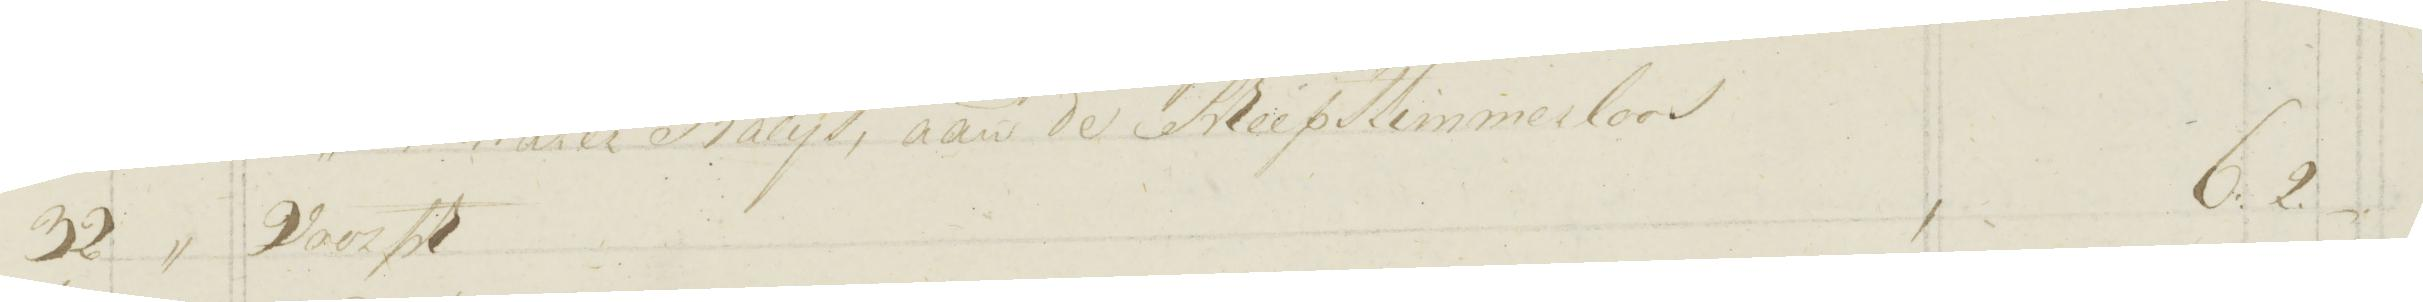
32 „ voorsz , 6: 2: —
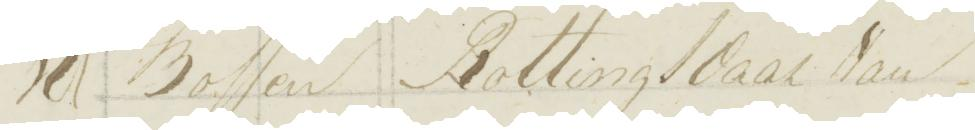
14 Bossen Rottings daar van
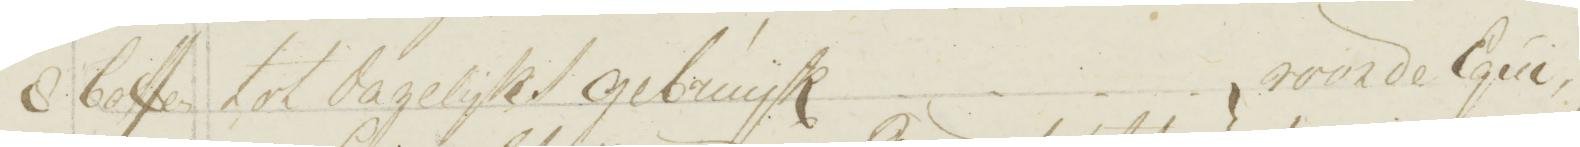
8: bossen tot dagelijks gebruijk - - - - voor de Equi,
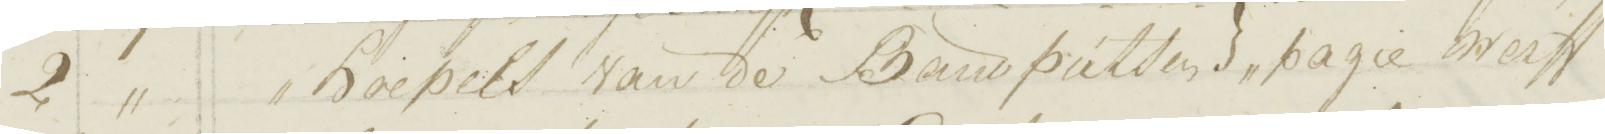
2 „ „ Hoepels van de Band pulsen „pagie werff
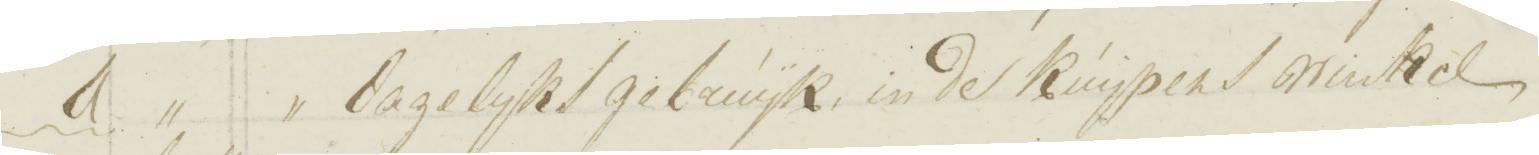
4 „ „ dagelyks gebruijk, in de kuijpers winkel
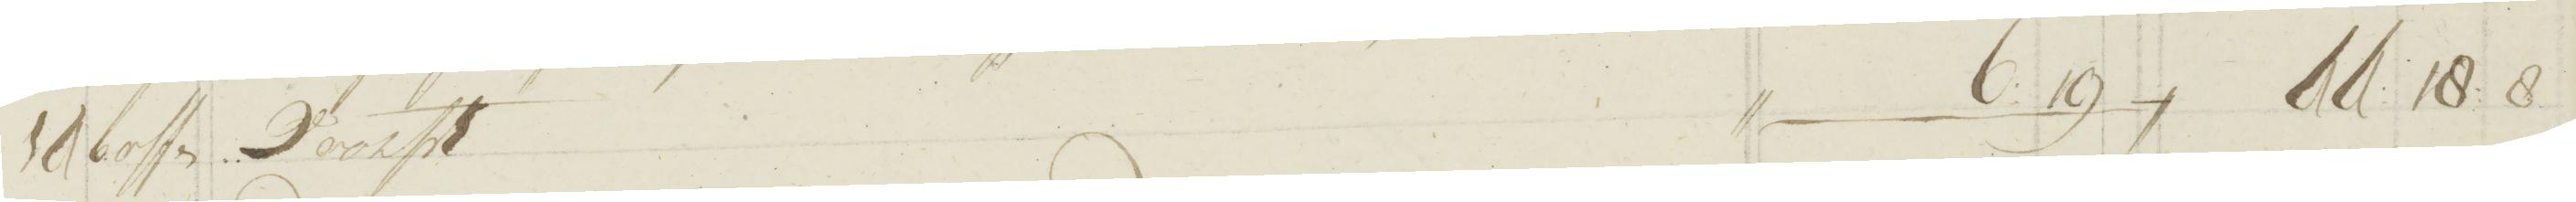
14 bossen . . Voorsz „ 6: 19 —„ 44: 18: 8
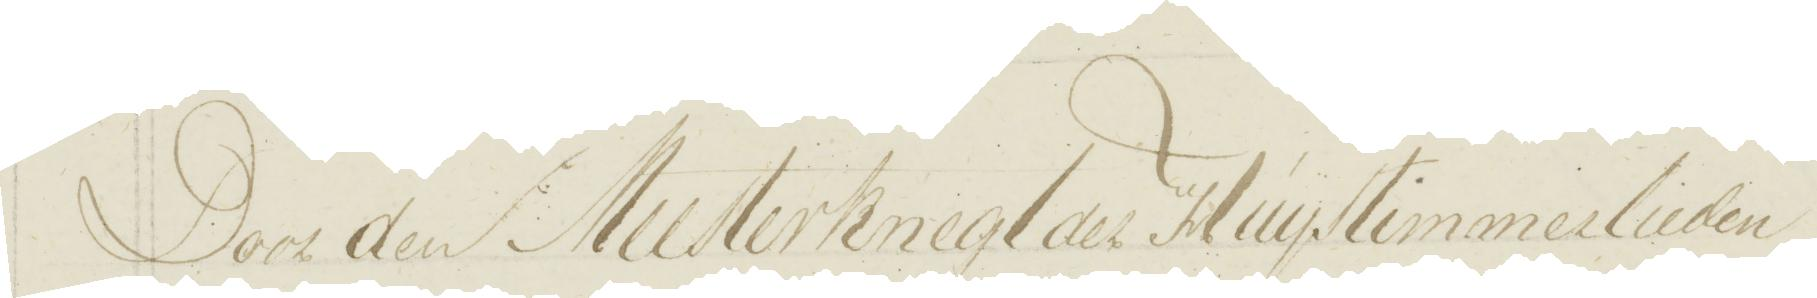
Door den Meesterknegt der Huijstimmerlieden
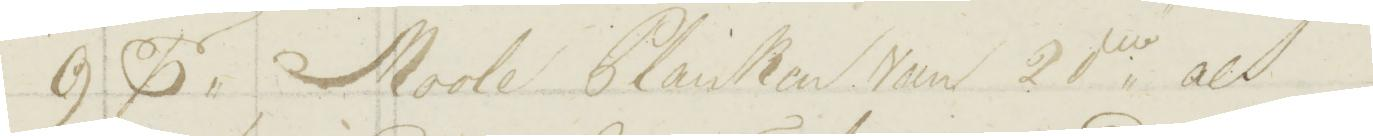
9 p„s Moole Planken van 2 d„m als
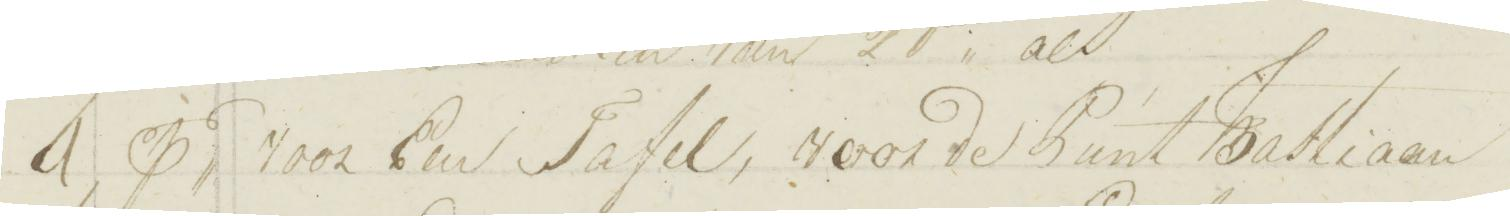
4 p„s Voor Een Tafel, voor de Punt Bastiaan
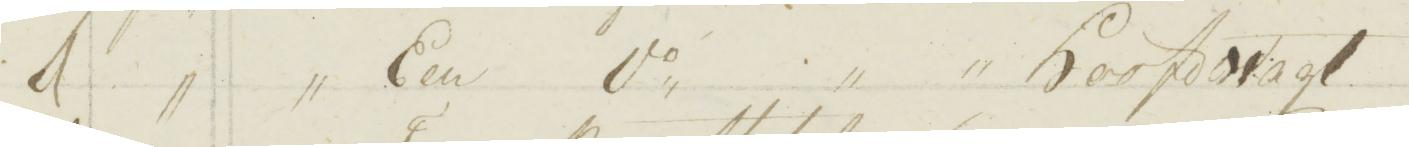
4 „ „ Een d„o „ „ hoofdwagt
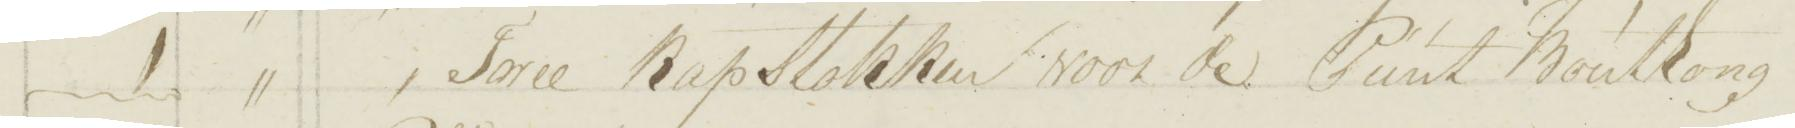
1. „ „ Twee kapstokken voor de Punt Bouthong
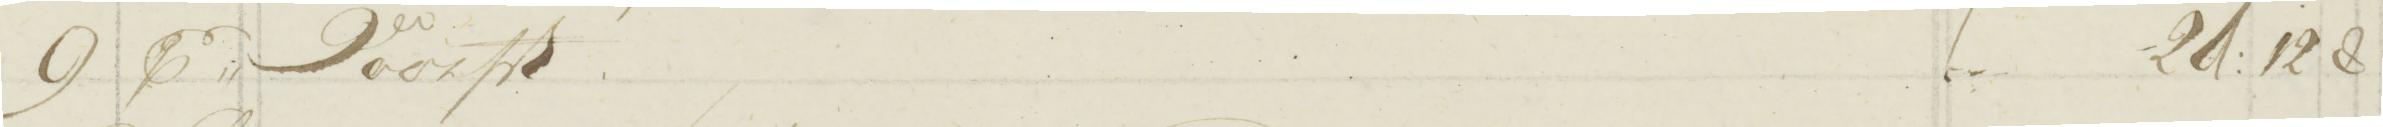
9 p„s Voorsz ƒ 24: 12 8
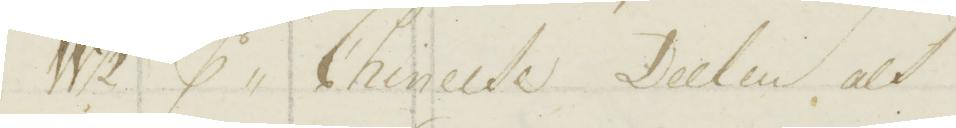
11½ p„s Chineese Deelen als
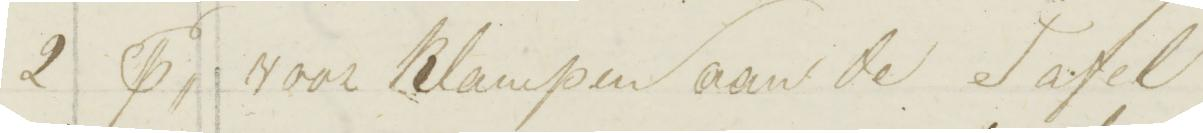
2 p„s voor Klampen aan de Tafel
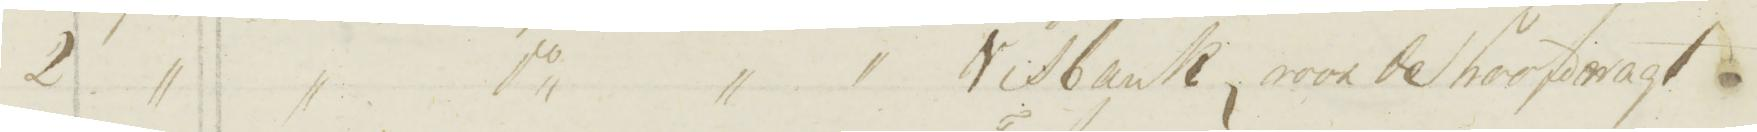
2 „ „ d„o „ „ Visbank voor de hoofdwagt
